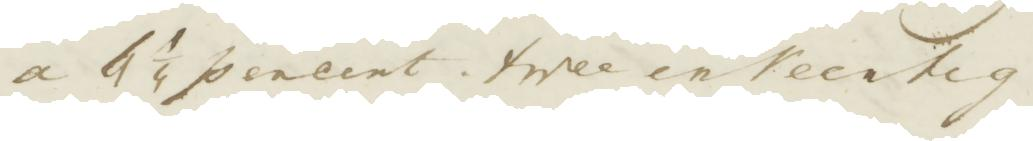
a 4¼ percent twee en veertig
